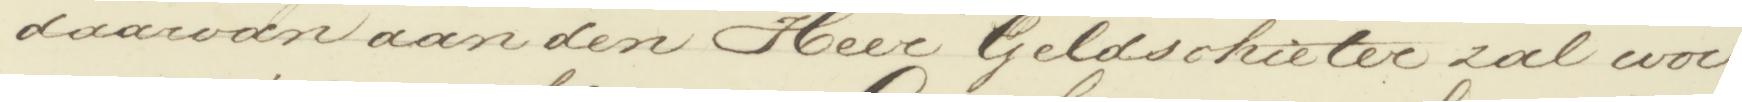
daarvan aan den Heer Geldschieter zal wor
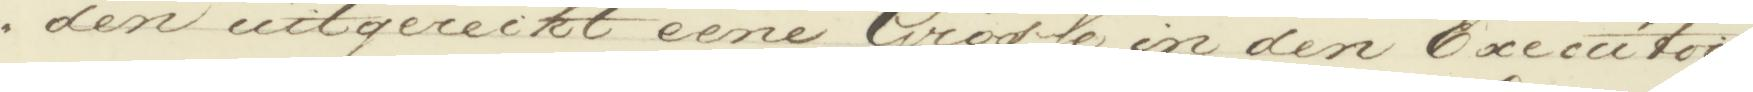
„ den uitgereikt eene Grosse in den Executoi
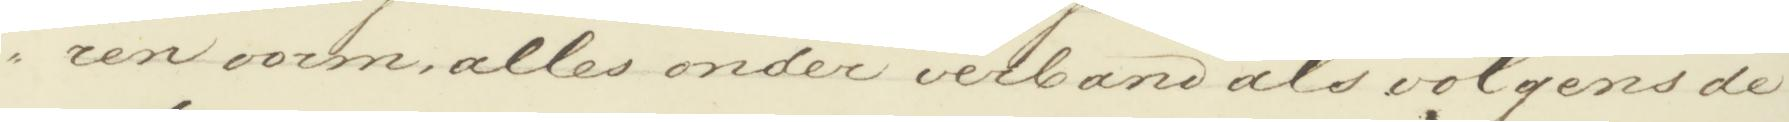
„ ren vorm, alles onder verband als volgens de
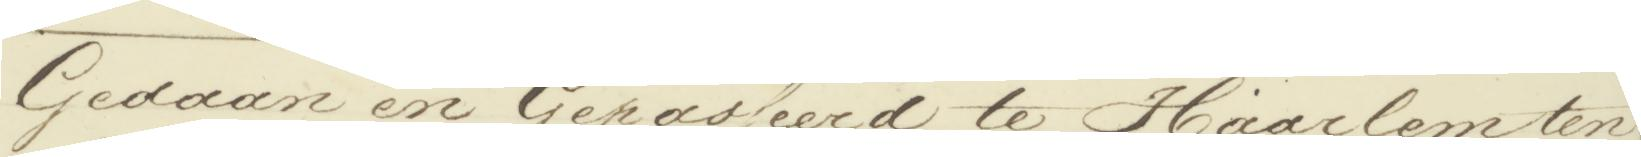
Gedaan en Gepasseerd te Haarlem ten
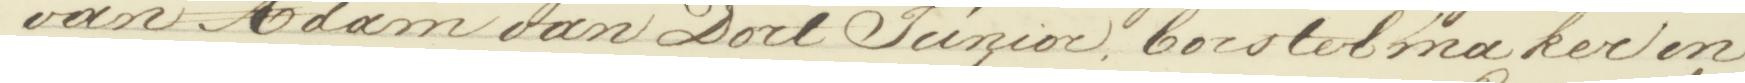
van Adam van Dort Junior, borstelmaker in
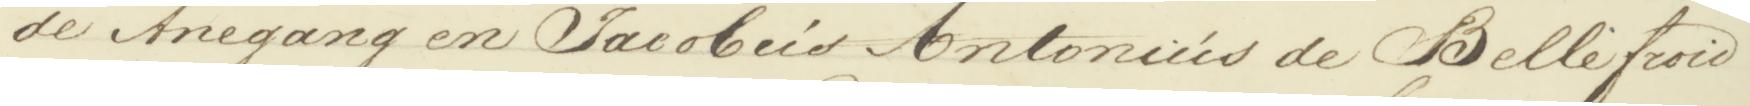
de Anegang en Jacobus Antonius de Bellefroid
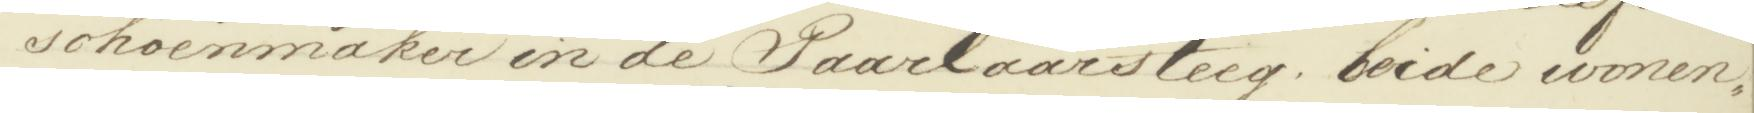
schoenmaker in de Paarlaarsteeg, beide wonen„
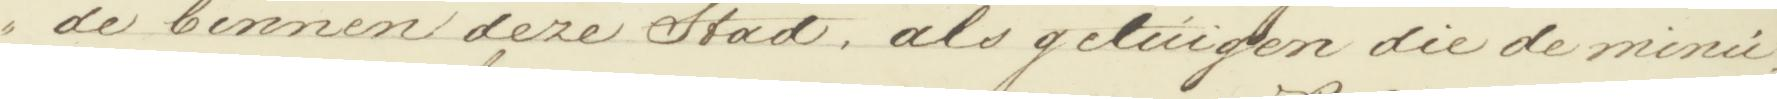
„ de binnen deze stad, als getuigen die de minu„
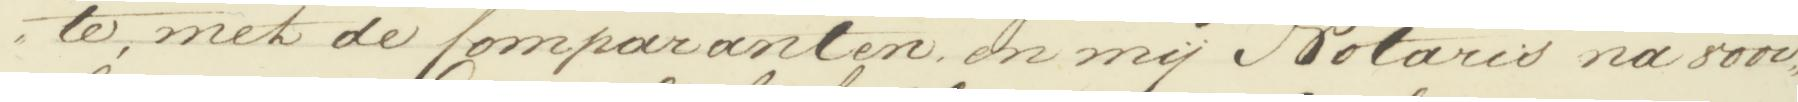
„ te, met de Comparanten, en mij Notaris na voor„
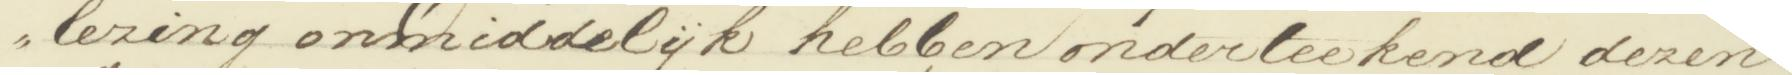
„ lezing onmiddelijk hebben onderteekend dezen
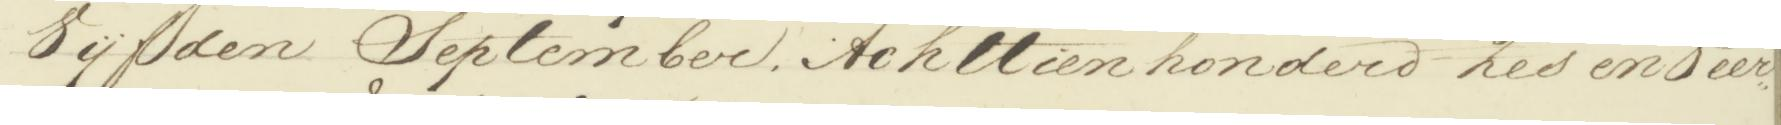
Vijf den September, Achttien honderd Zes en Veer„
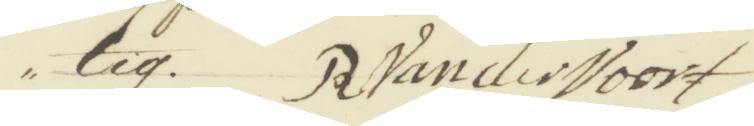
„tig. R Van der Voort
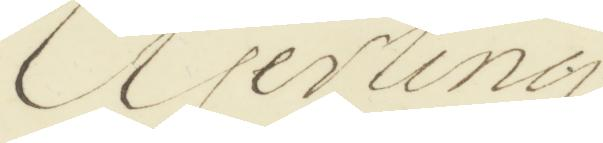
CGerlingsJr
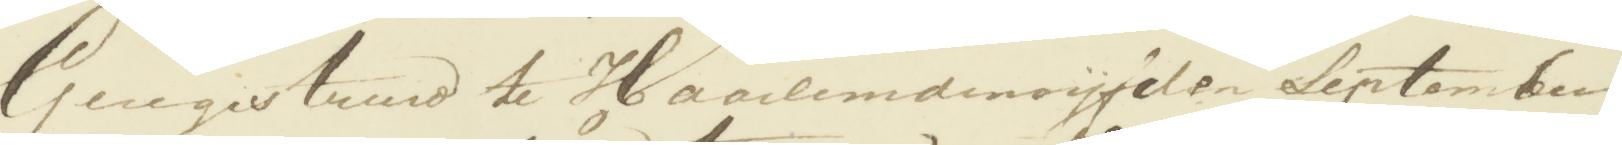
Geregistreerd te Haarlemdenvijfden September
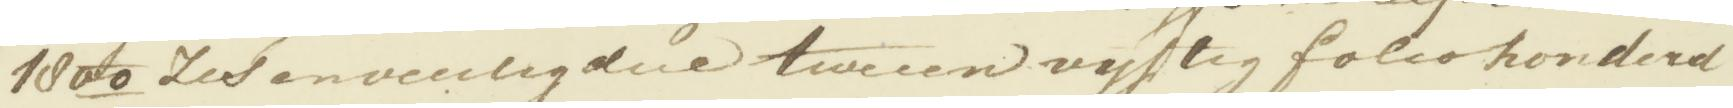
1800 Zes en veertig deel tweeen vyftig foliohonderd
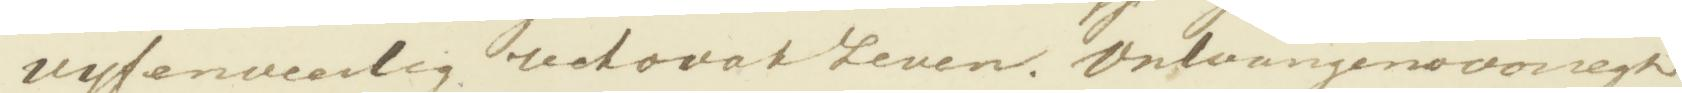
vyfenveertig rectovakzeven, Ontvangenvoorregt
